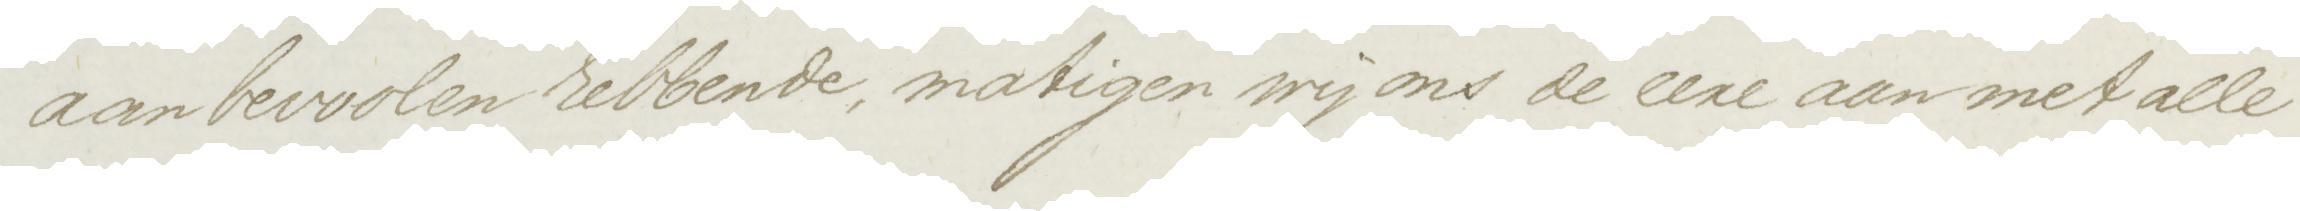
aan bevoolen hebbende, matigen wij ons de eere aan met alle
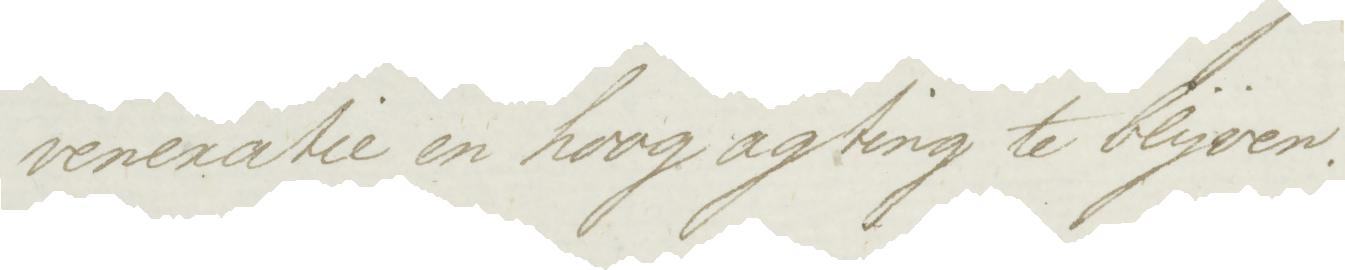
veneratie en hoog agting te blijven
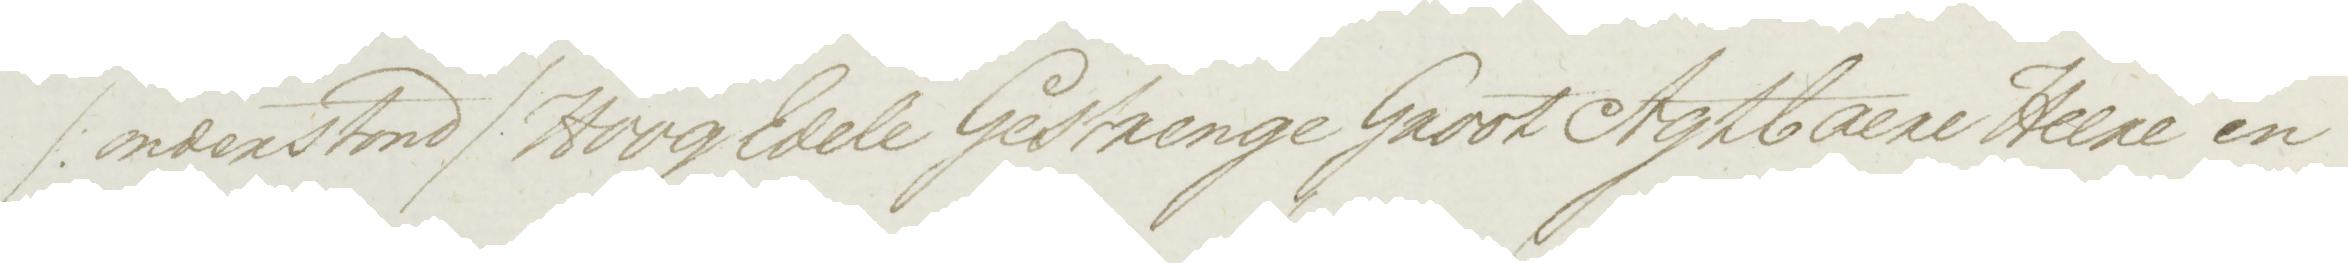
/:onderstond/. Hoog Edele Gestrenge Groot Agtbaere Heere en
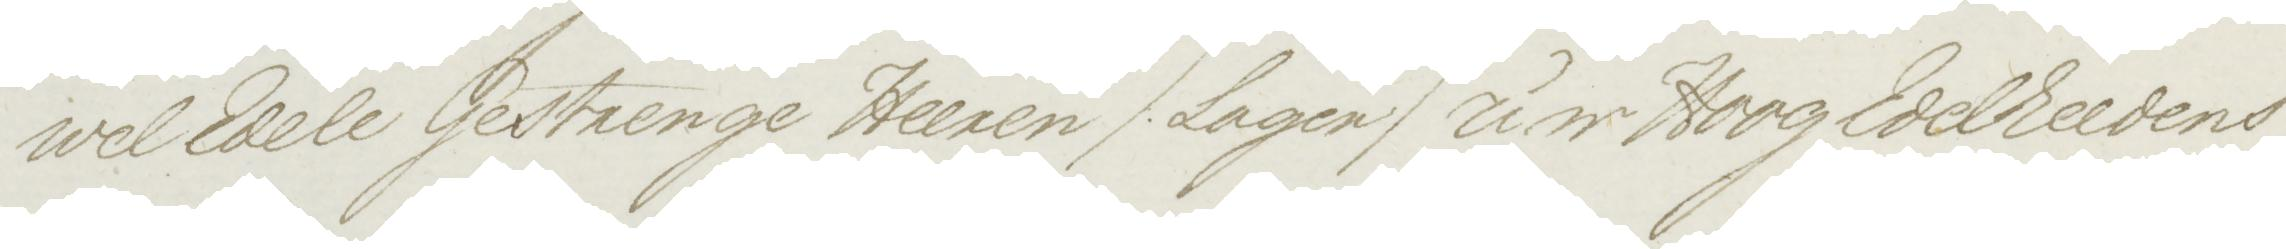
wel Edele Gestrenge Heeren /:Lager:/ uw Hoog Edelheedens
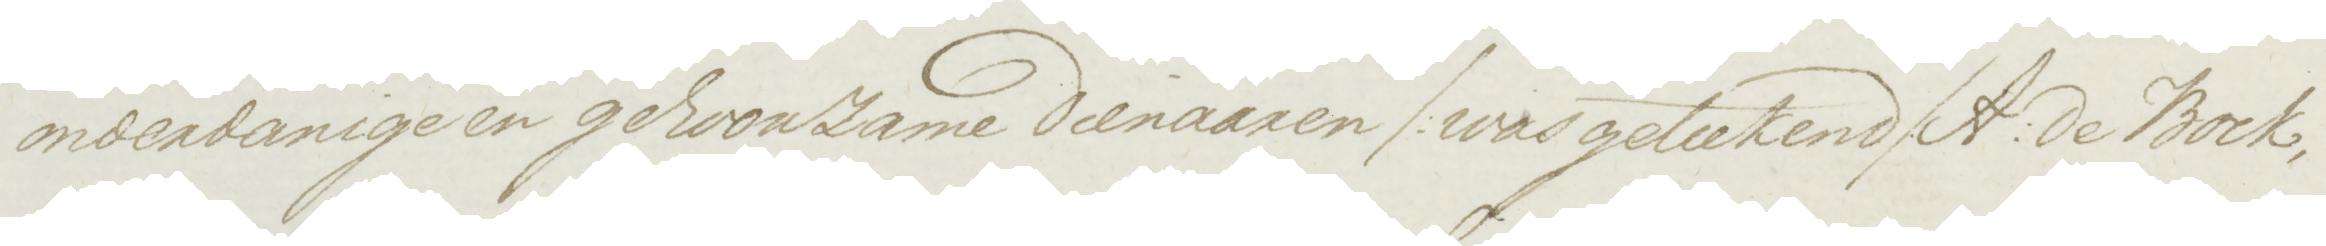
onderdanige en gehoorzame dienaaren /:was geteekend / A: de Bock,
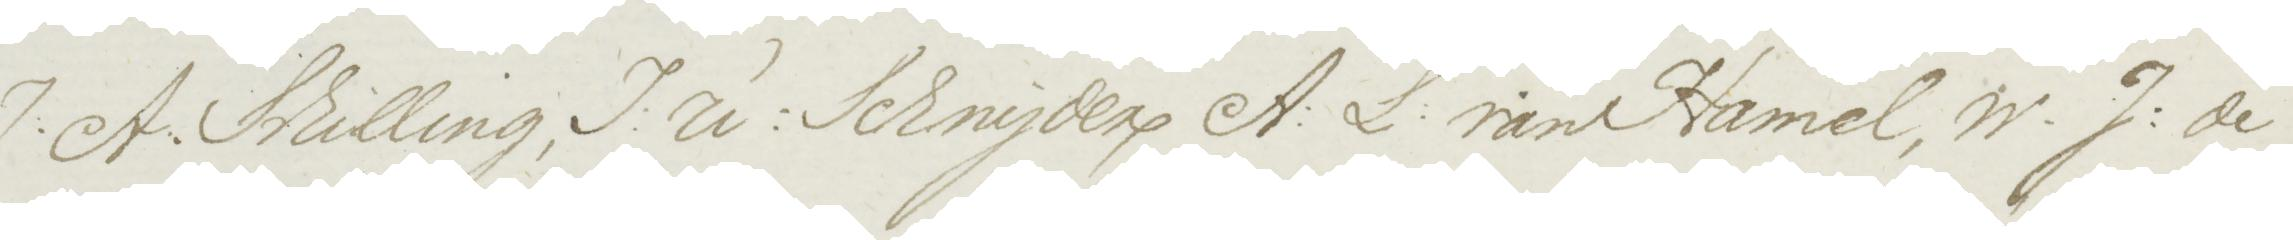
J: A: Schilling, I: u: Schnijder A: L: van Hamel, W. J: de
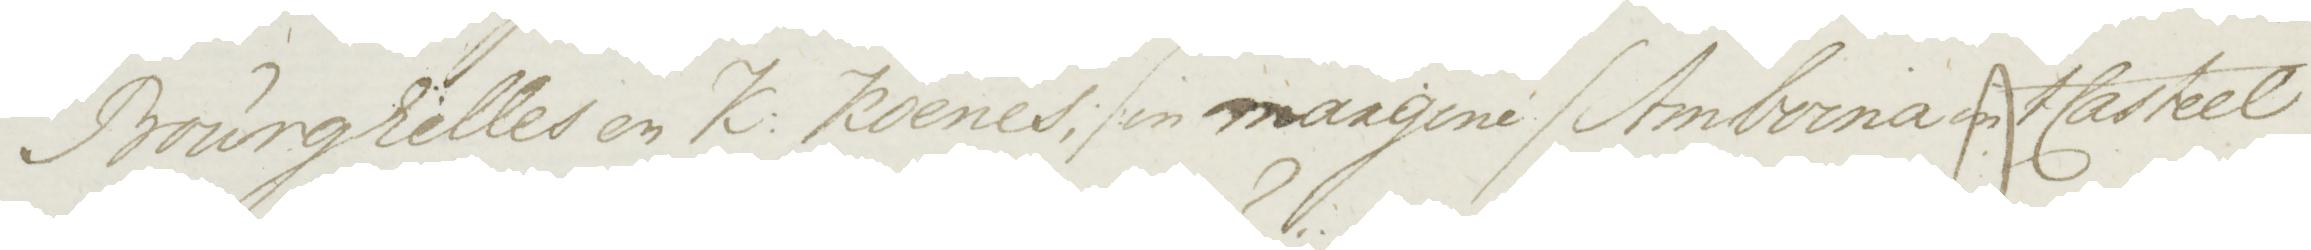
Bourghelles en K: Koenes: /:in margine'/ Amboina in t Casteel
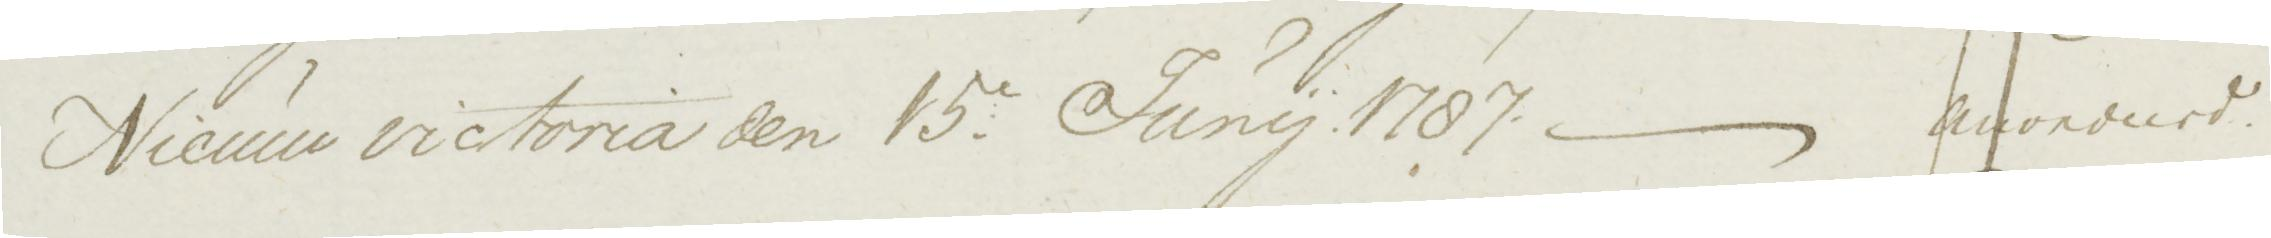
Nieuw victoria den 15:e Iunij 1787. Accordeerd.
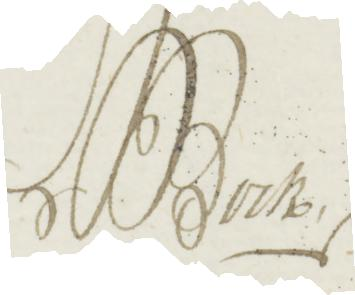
A„De„Bock.
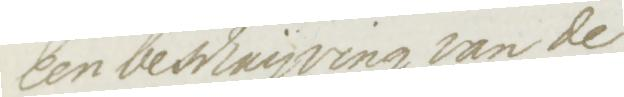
Een beschrijving van de
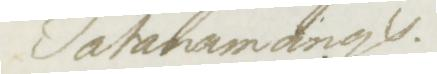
Tatanamangs.
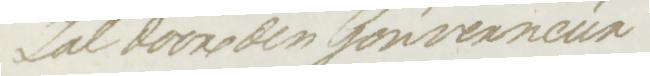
zal door den Gouverneur
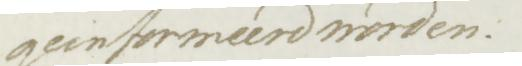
geinformeerd worden.
